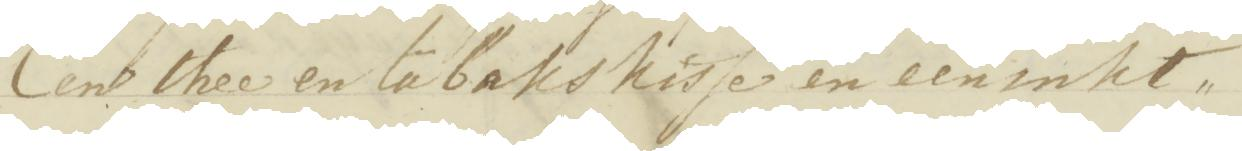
Een thee en tabakskisje en een inkt„
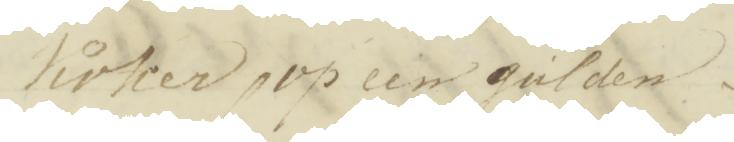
koker, op een gulden . . . . . . „ 1 „ —
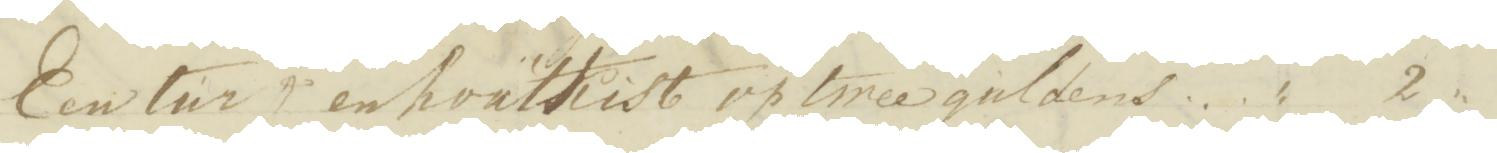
Een turf en houtkist op twee guldens . . . „ 2 „ —
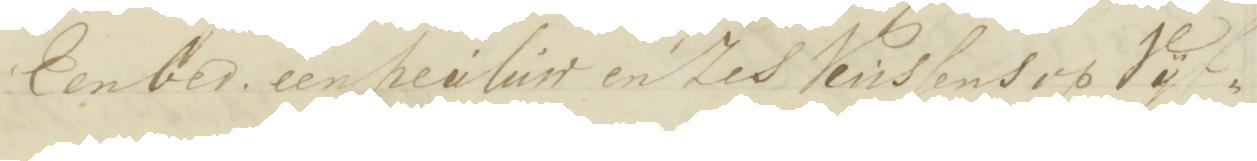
Een bed, een peuluw en Zes Kussens op Vijf„
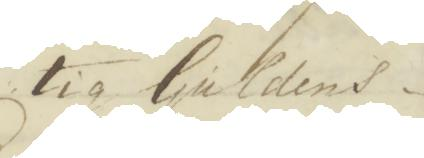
„tig Guldens . . . . . . . . . . . „ 50 „ —
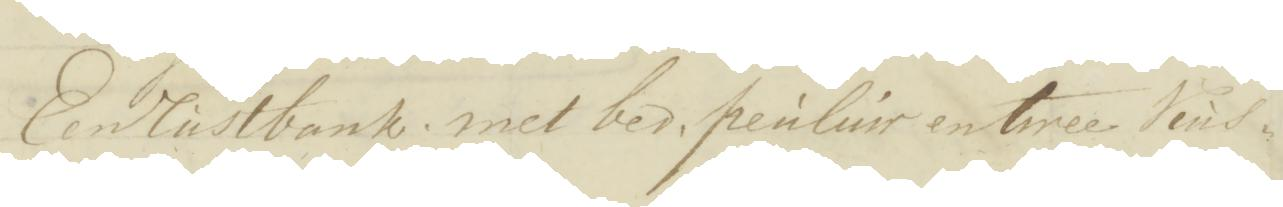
Een rustbank met bed, peuluw en twee Kus„
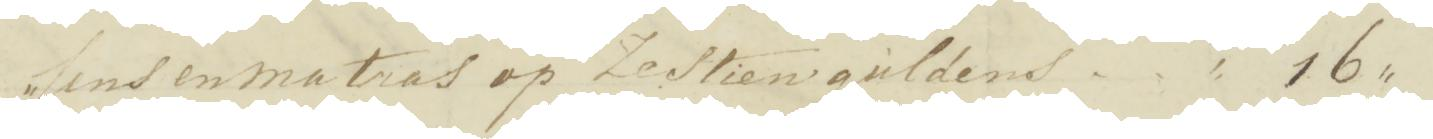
„sens en matras op Zestien guldens . . „16 „ —
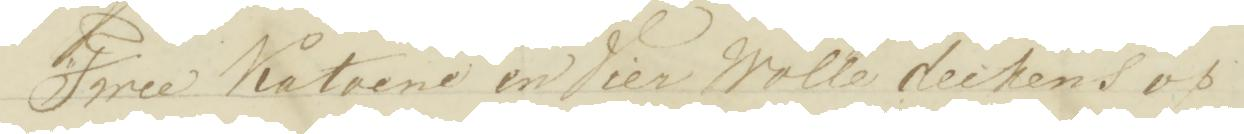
Twee Katoene en Vier wolle deekens op
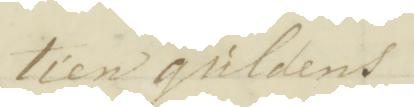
tien guldens . . . . . . . . „ 10 „ —
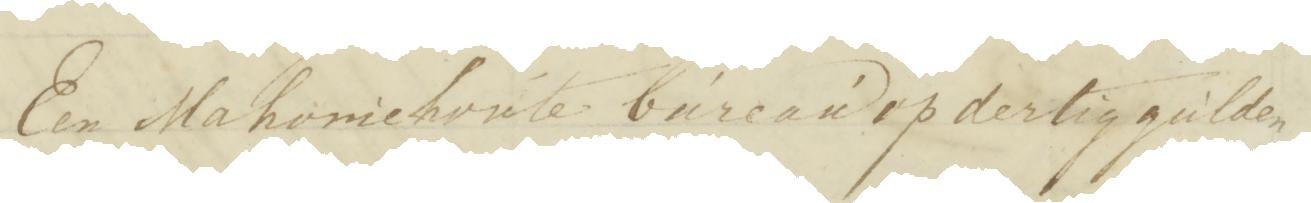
Een Mahoniehoute bureau op dertig gulden 30 „ —
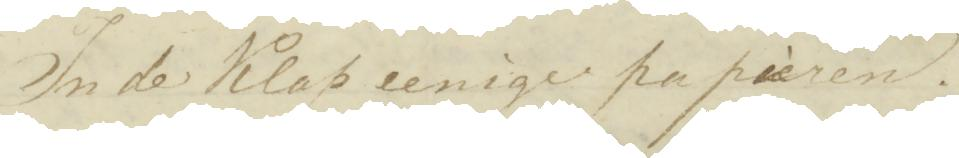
Jn de Klap eenige papieren.
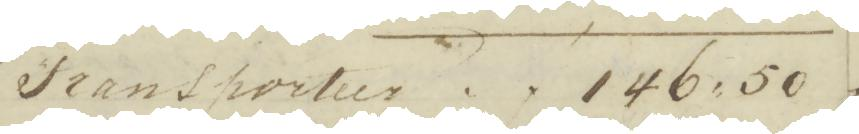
Transporteer . ƒ 146 „ 50
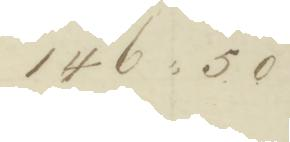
ƒ 146 „ 50
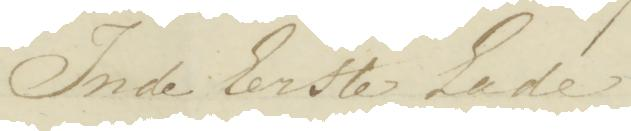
Jn de Eerste Lade
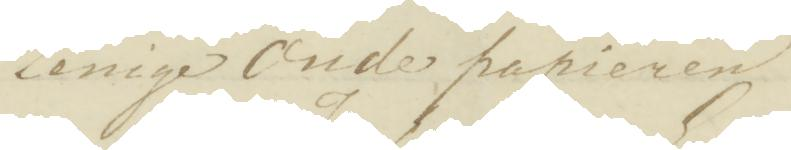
Eenige oude papieren
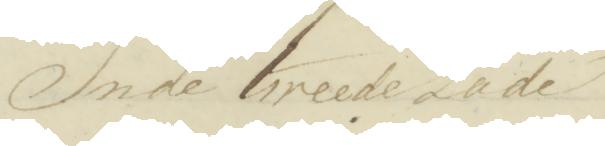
Jn de tweede Lade
